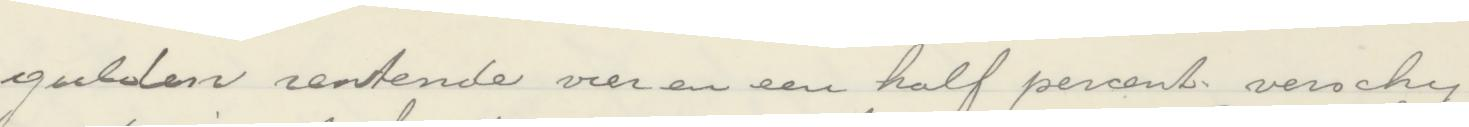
gulden rentende vier en een half percent verschy
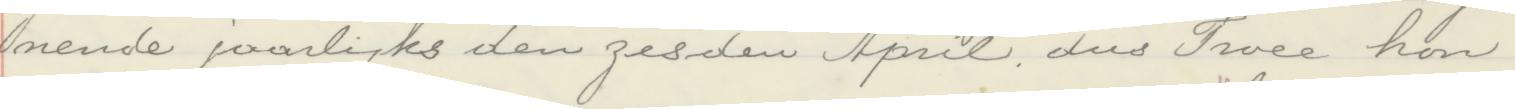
nende jaarlijks den zesden April, dus Twee hon
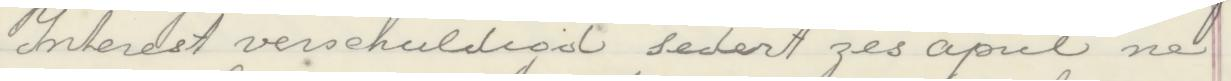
Interest verschuldigd sedert zes april ne
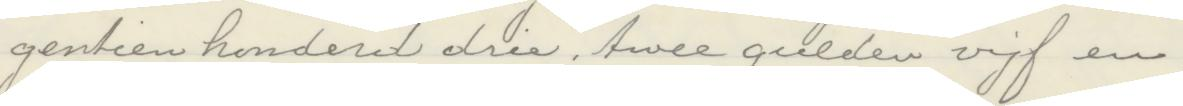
gentien honderd drie, twee gulden vijf en
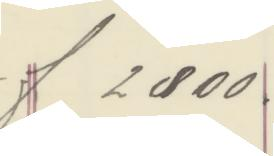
ƒ 2800
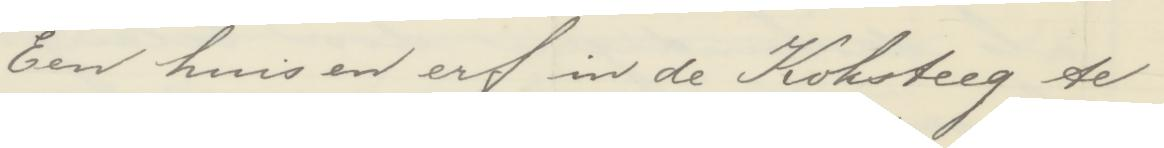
Een huisen erf in de Koksteeg te
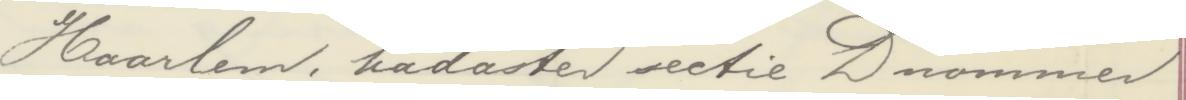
Haarlem, kadaster sectie D nommer
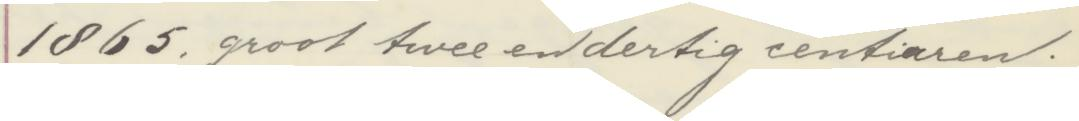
1865. groot twee en dertig centiaren.
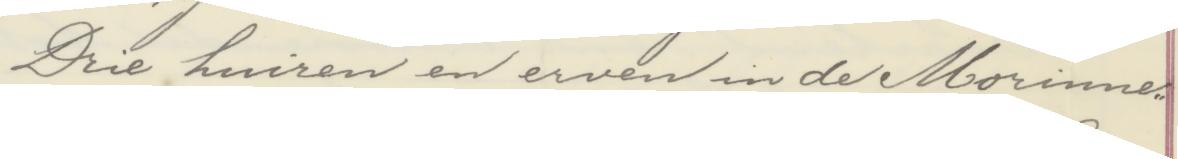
Drie huizen en erven in de Morinne„
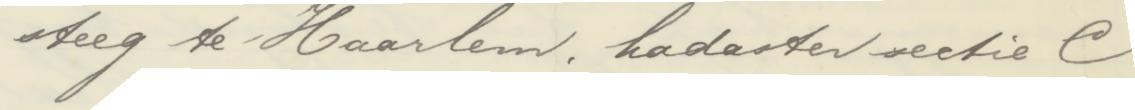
steeg te Haarlem, kadaster sectie C
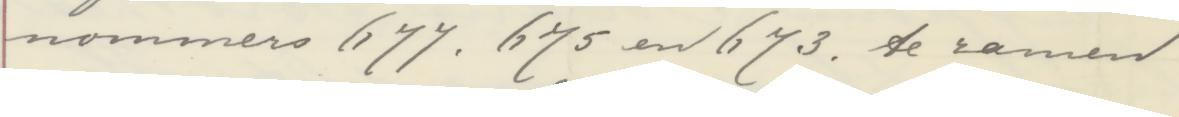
nommers 677. 675 en 673. te zamen
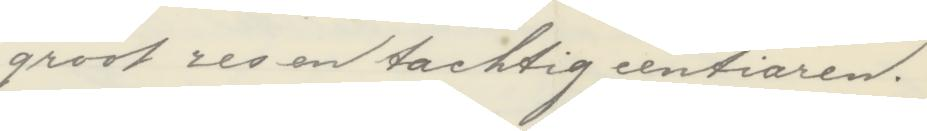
groot zes en tachtig centiaren.
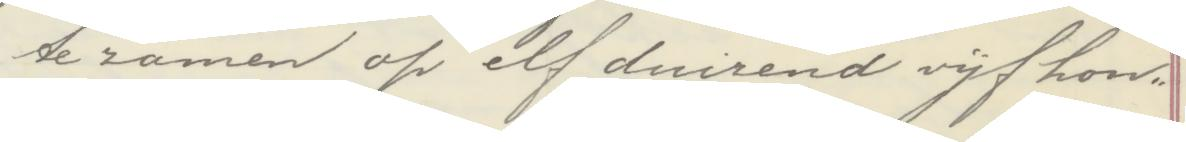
te zamen op elf duizend vijf hon„
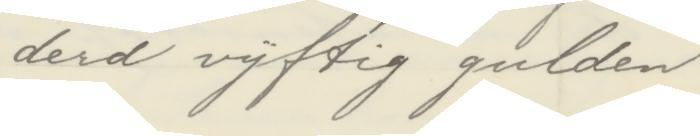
derd vijftig gulden
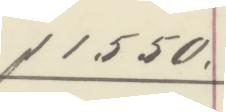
11,550.
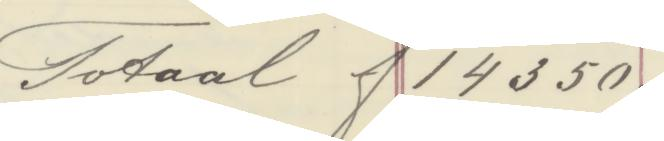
Totaal ƒ14550,
